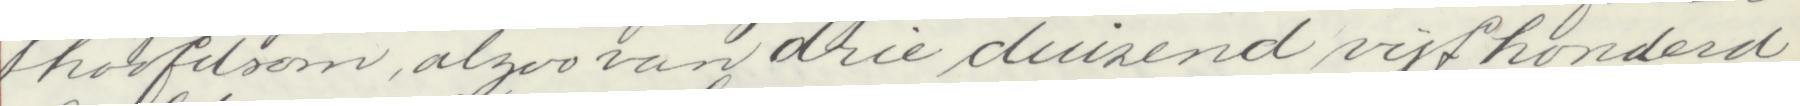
hoofdsom, alzoo van drie duizend vijf honderd
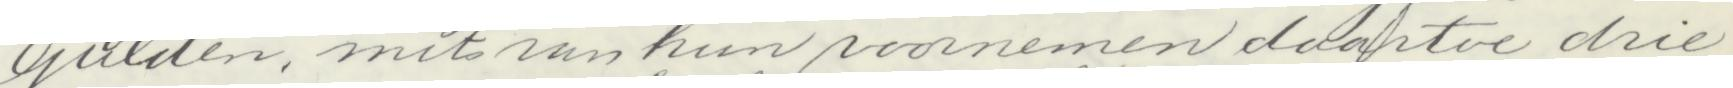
gulden, mits van hun voornemen daartoe drie
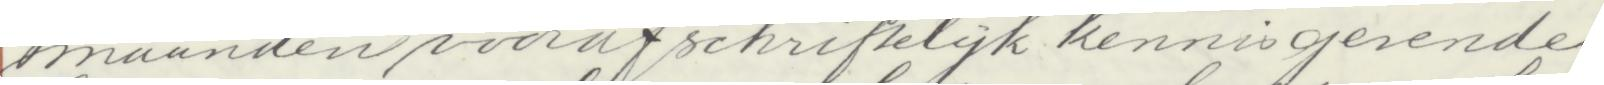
maanden voor afschriftelijk kennis gevende.
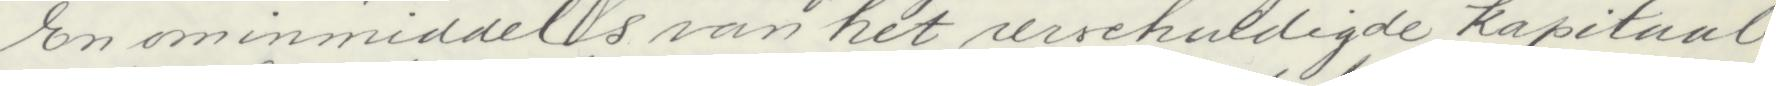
En om inmiddels van het verschuldigde kapitaal
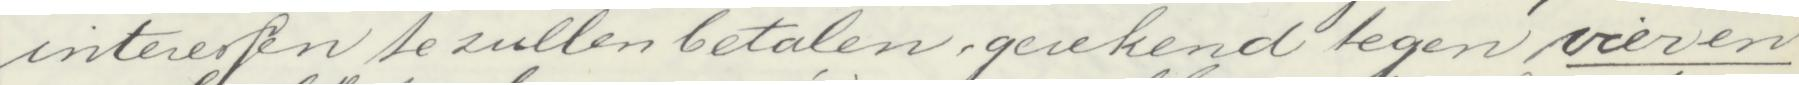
interessen te zullen betalen, getekend tegen vier en
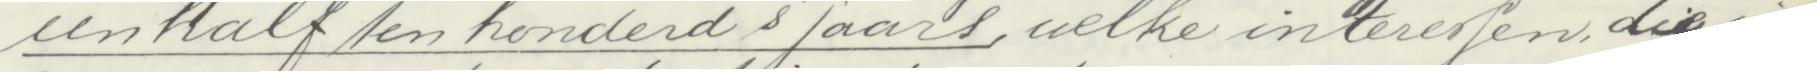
een half ten honderd s' jaars, welke interessen, die in„
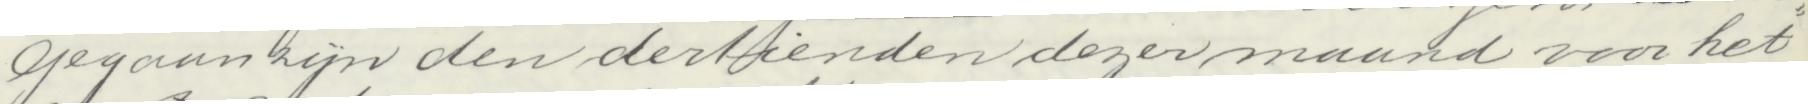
gegaan zijn den dertienden dezer maand voor het
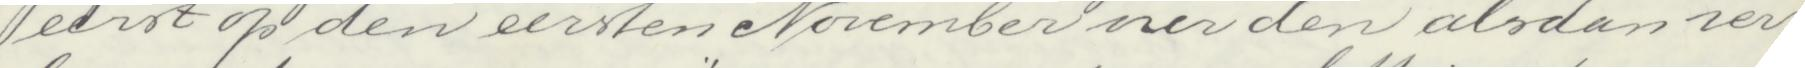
eerst op den eersten November verder alsdan ver
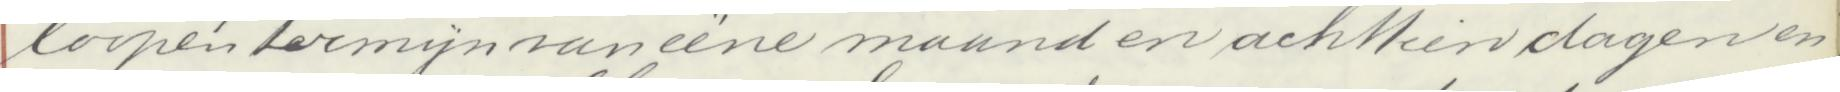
loopen termijn van eene maand en achttien dagen en
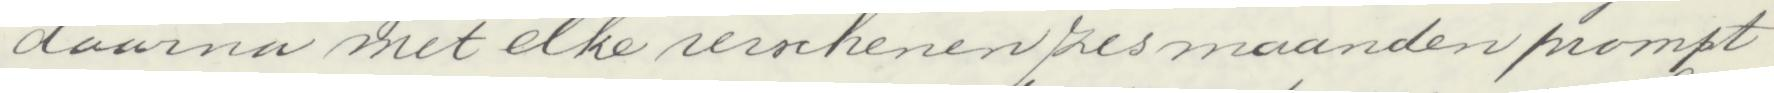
daarna met elke verschenen zes maanden prompt
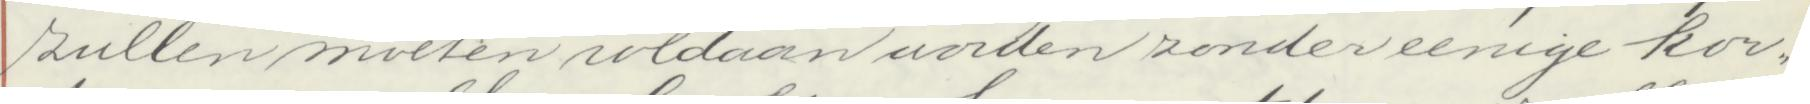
zullen moeten voldaan worden zonder eenige kor„
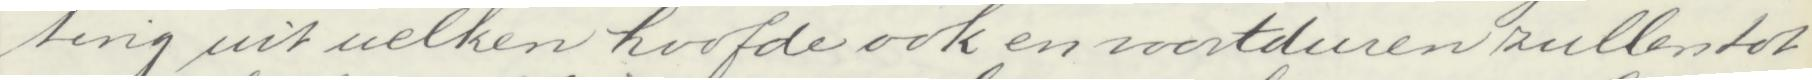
ting uit welken hoofde ook en voortduren zullen tot
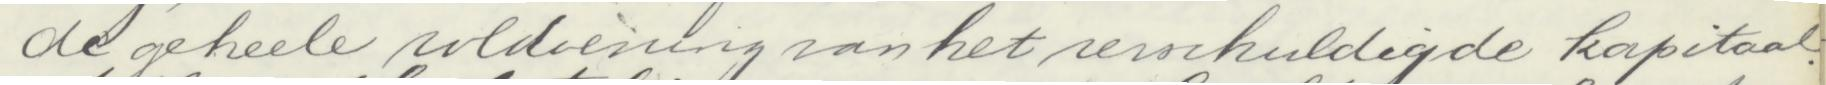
de geheele voldoening van het verschuldigde kapitaal
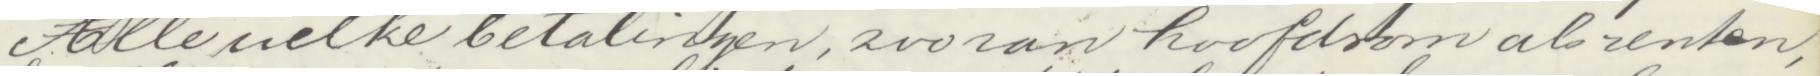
Alle welke betalingen, zoo van hoofdsom als renten,
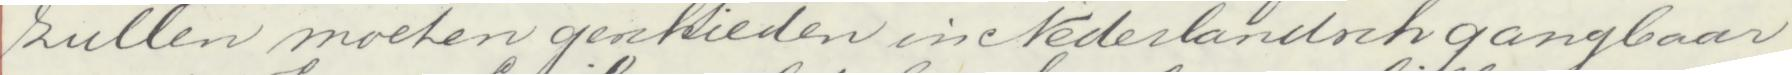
zullen moeten geschieden in Nederlandsch gangbaar
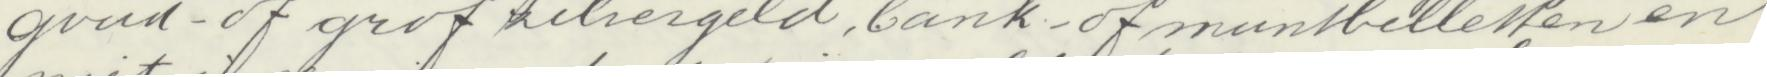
goud- of grof zilvergeld, bank- of muntbilletten en
